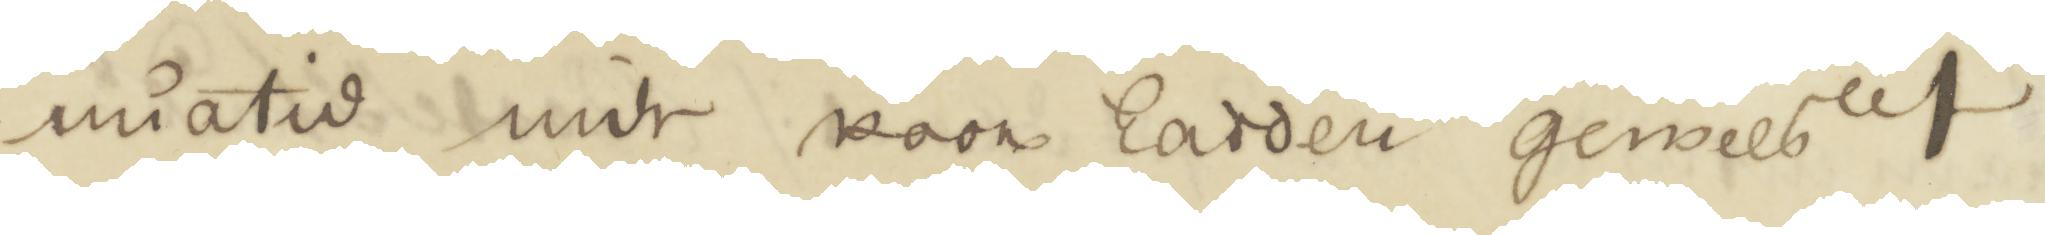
nuatie niet voor hadden geweest
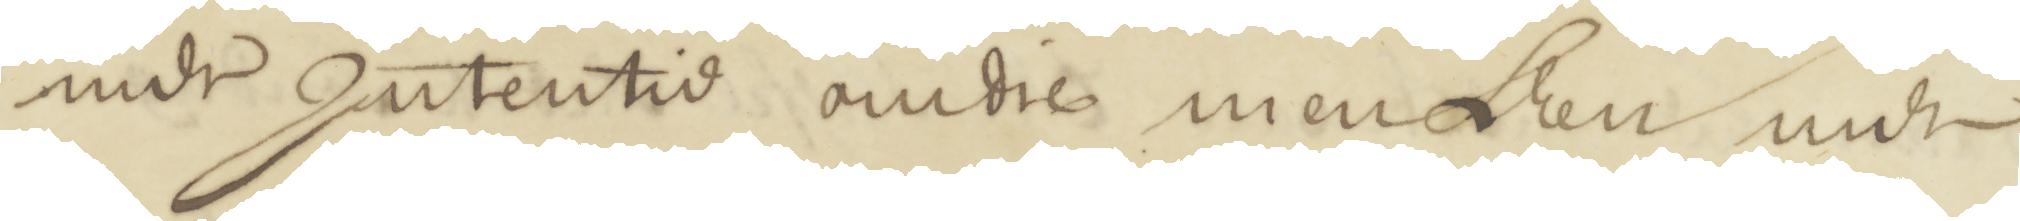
met Jntentie om die menschen met
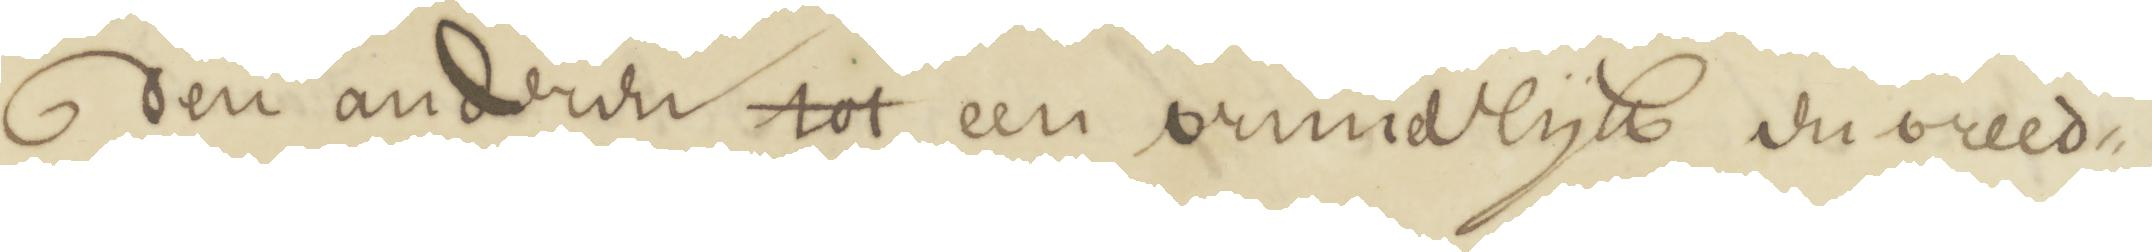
den anderen tot een vrundelijk en vreed„
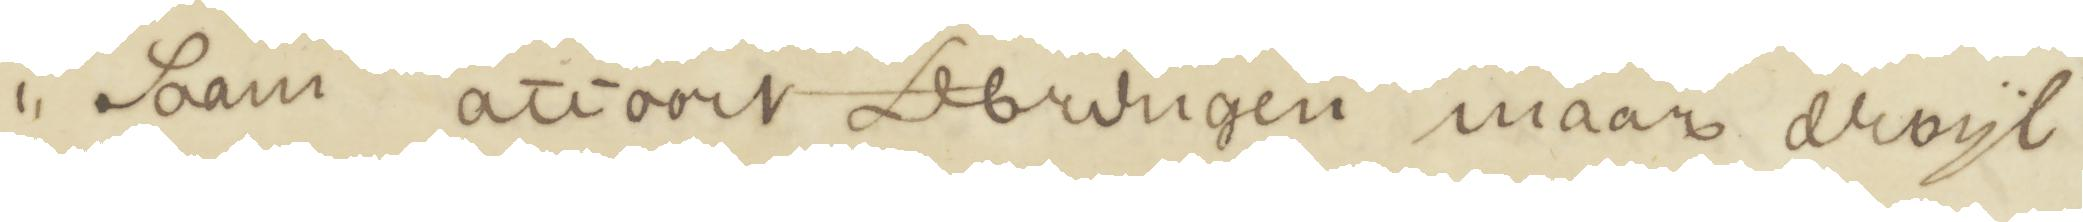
„saam accoort tebrengen maar dewijl
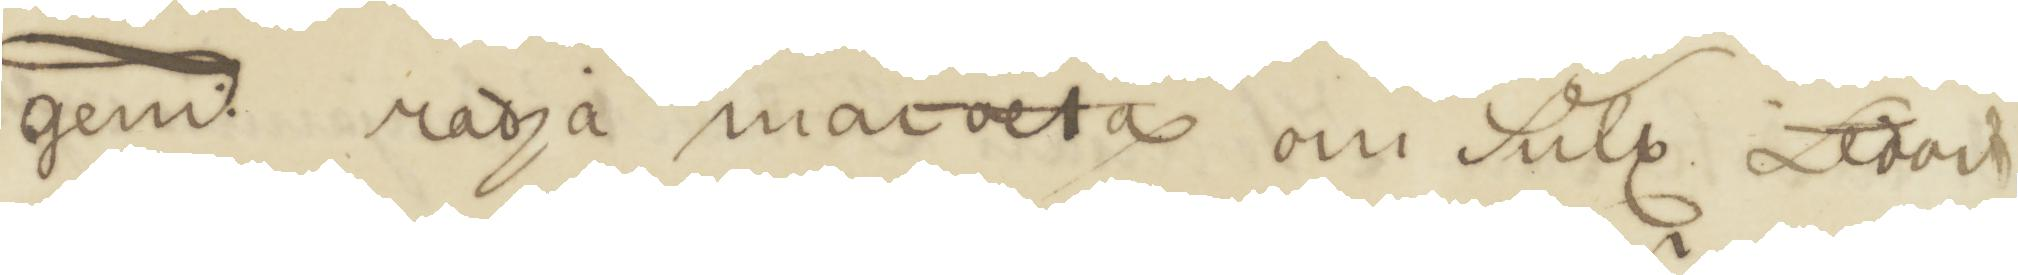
gem: radja macoeta om sulx te doen
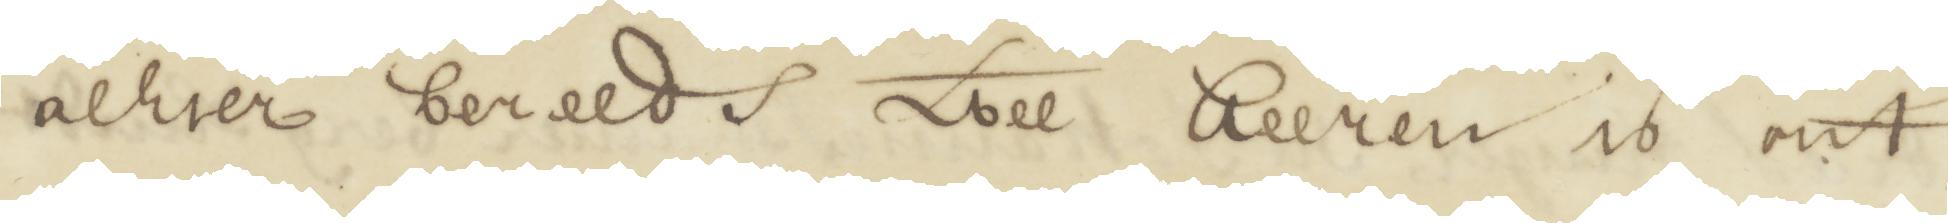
alhier bereeds twee keeren is ont
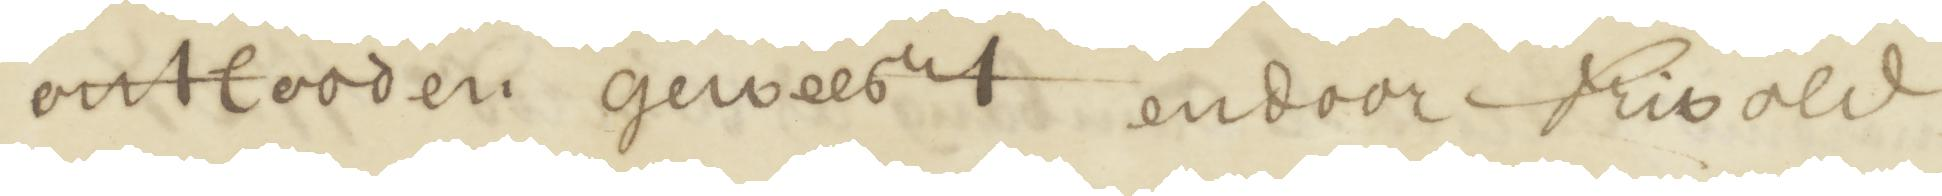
ontbooden geweest en door frivole
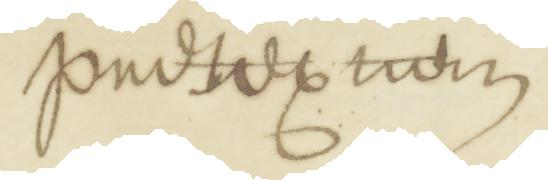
pretextien
